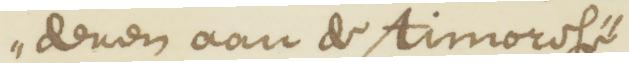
„deren aan de timorese„
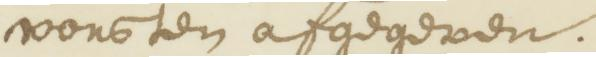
vorsten afgegeven.
